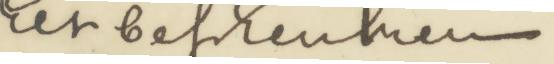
het beschenken
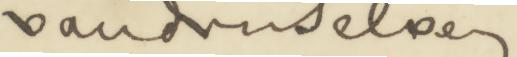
van denselven
